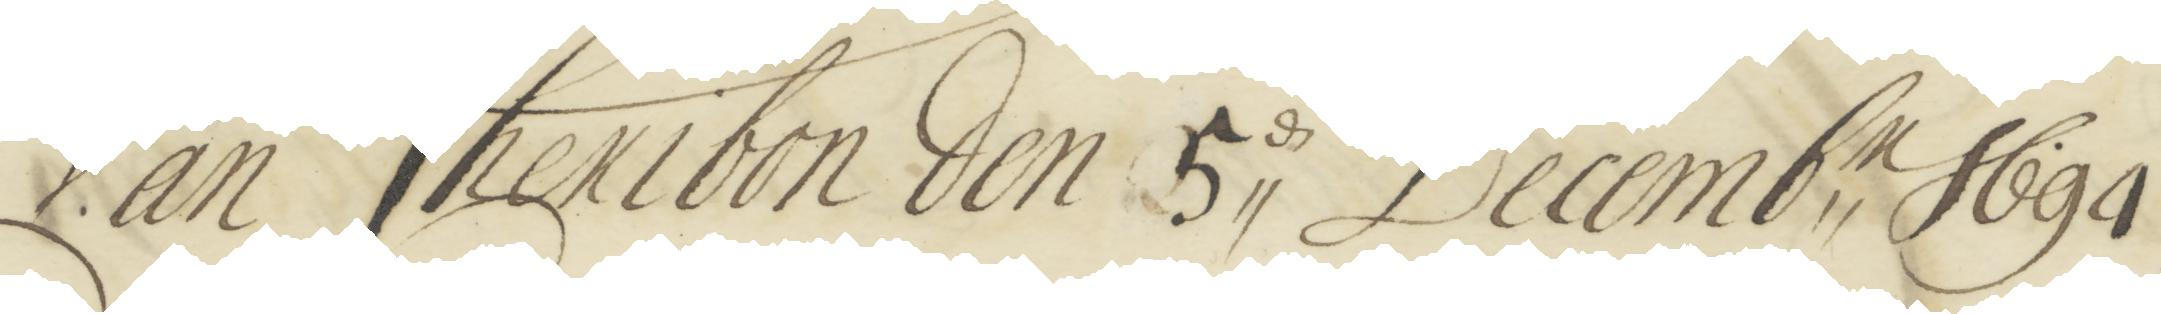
Van Cheribon den 5„en Decemb„r 1694
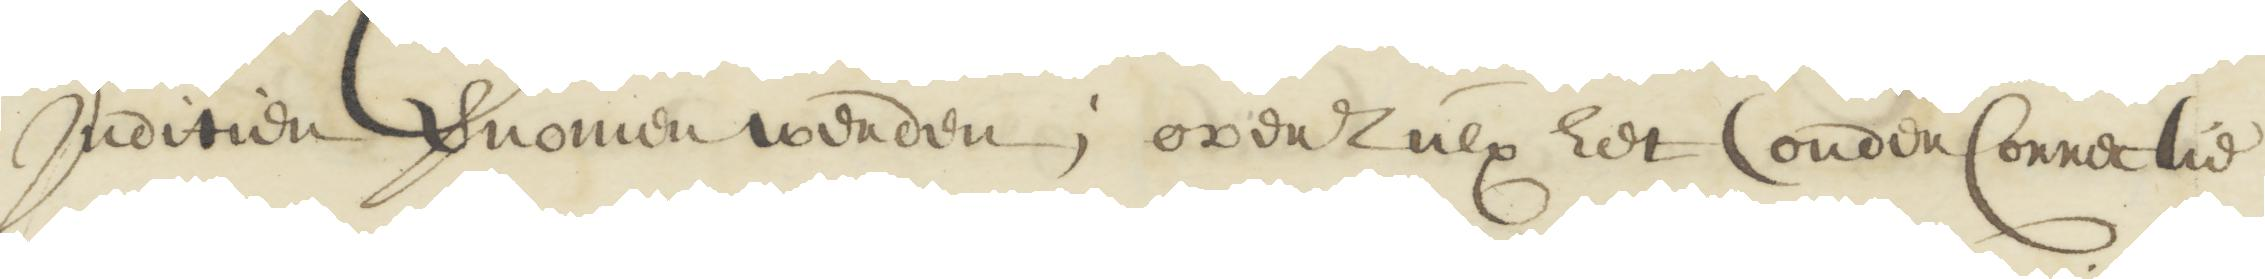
Inditien vernomen werden; overzulx het (onder Correctie
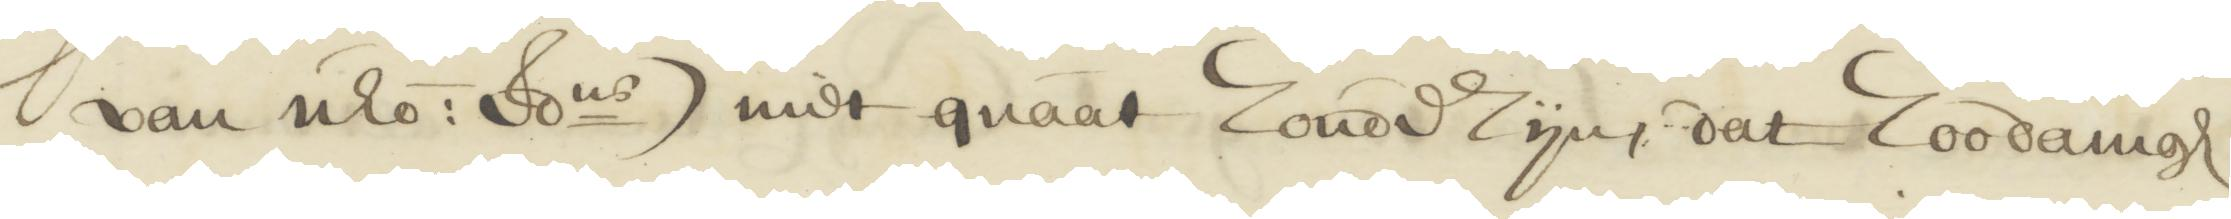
van uho: Ed=ns) niet quaat zoude zijn, dat zoodanigh
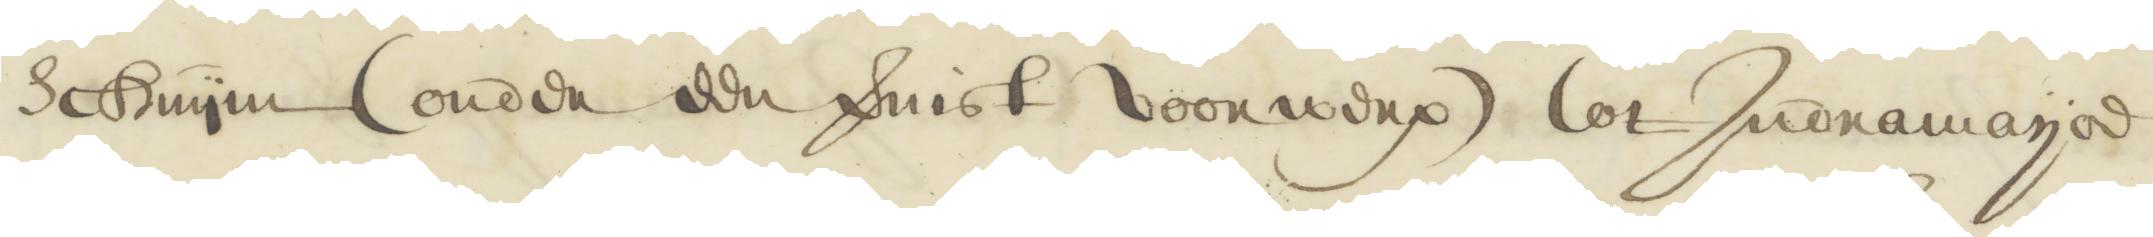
schuijm (onder een vernist voorwerp) tot Indramaijoe
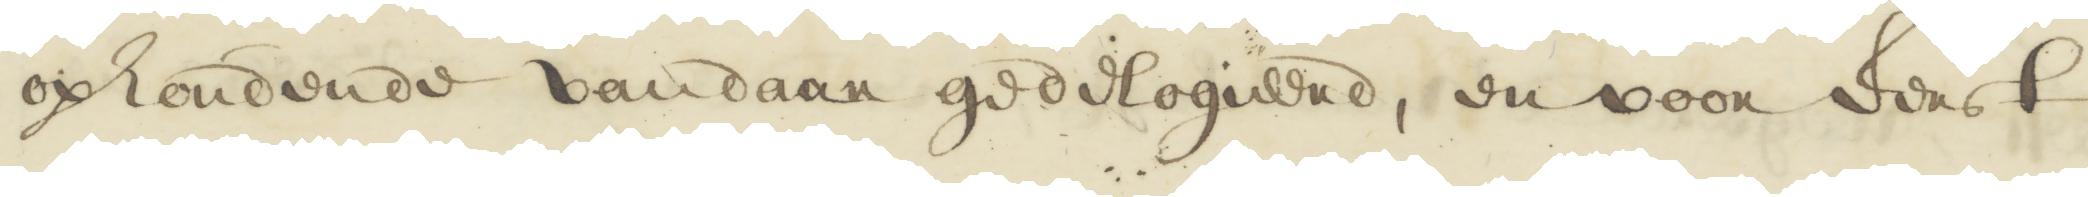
ophoudende van daar gedelogieerd, en voor Eerst
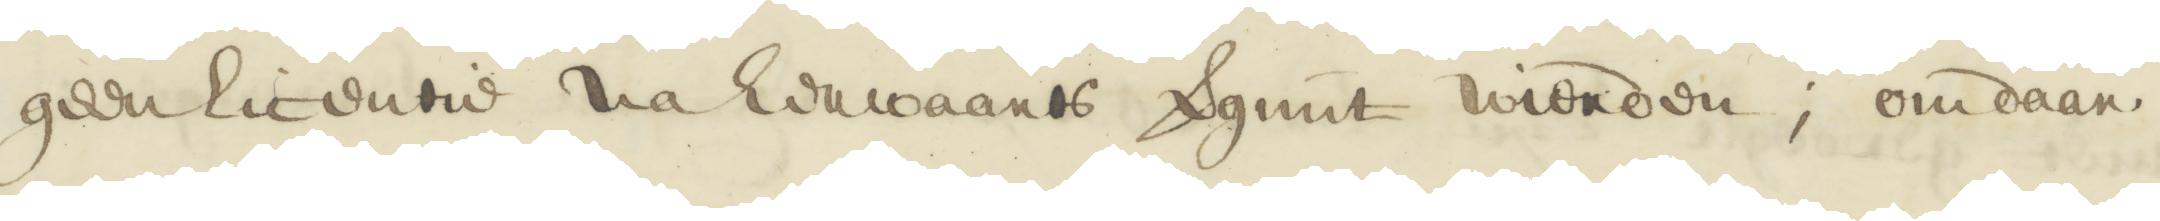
geen licentie na herwaarts vergunt wierden; om daar
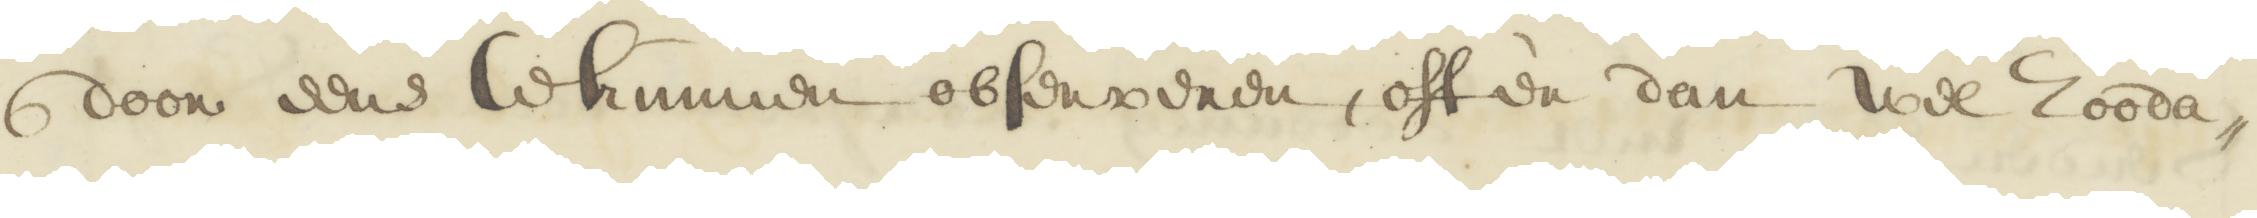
door eens te kunnen observeren, off er dan wel zooda„
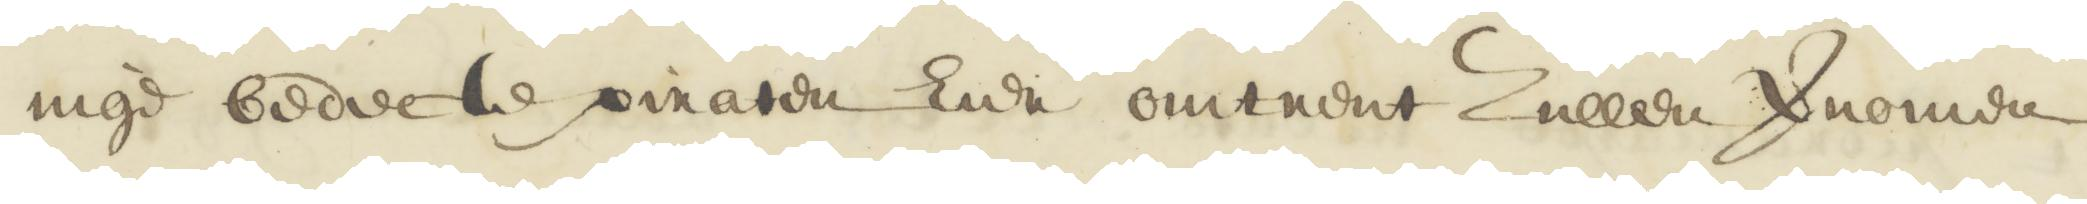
nige bedelte piraten hier omtrent zullen vernomen
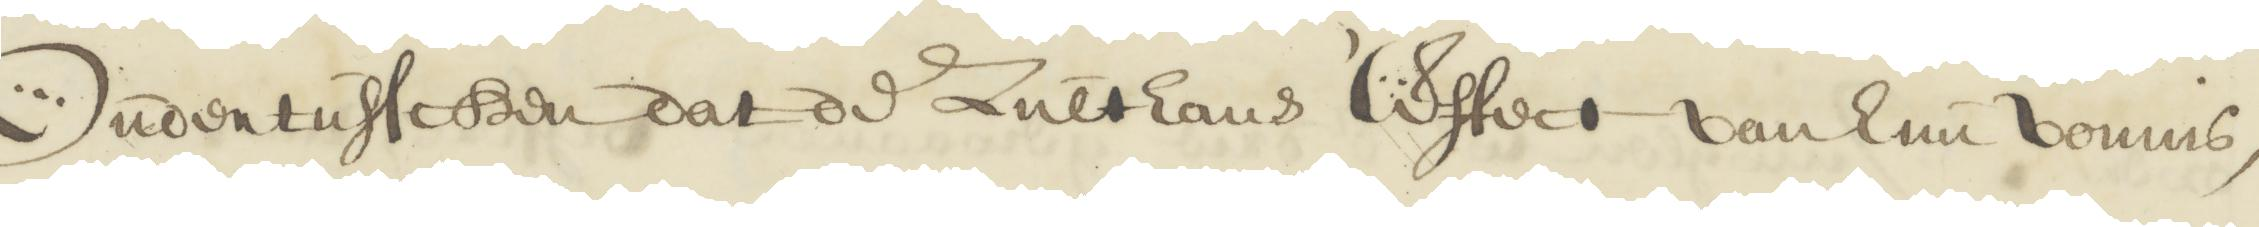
Ondertusschen dat de Zulthans 't effect van hun vonnis,
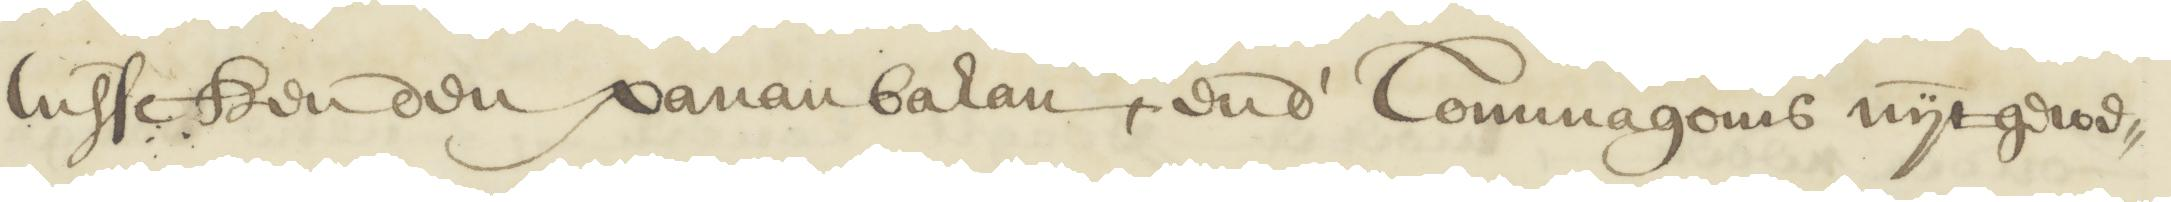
tusschen den pananbahan, en d’ Tommagoms uijt gewe„
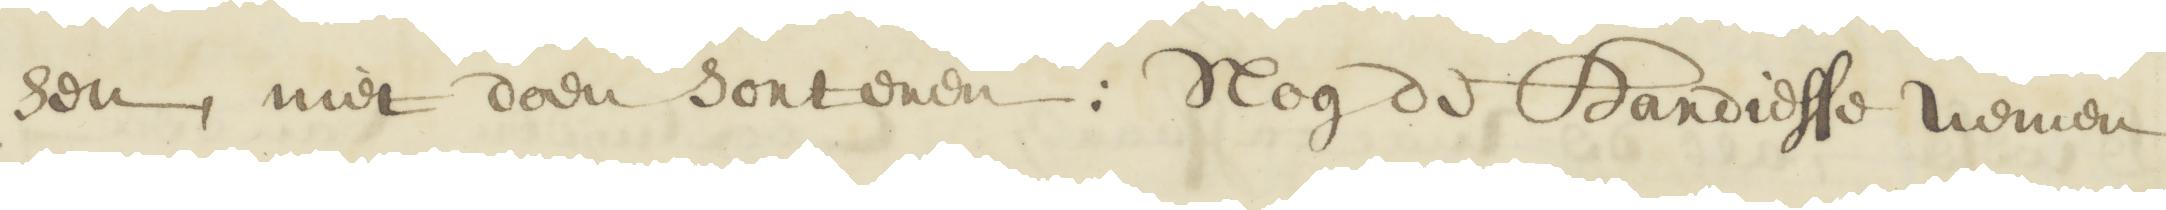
sen, niet doen sorteren: Nog de Bardiesse nemen
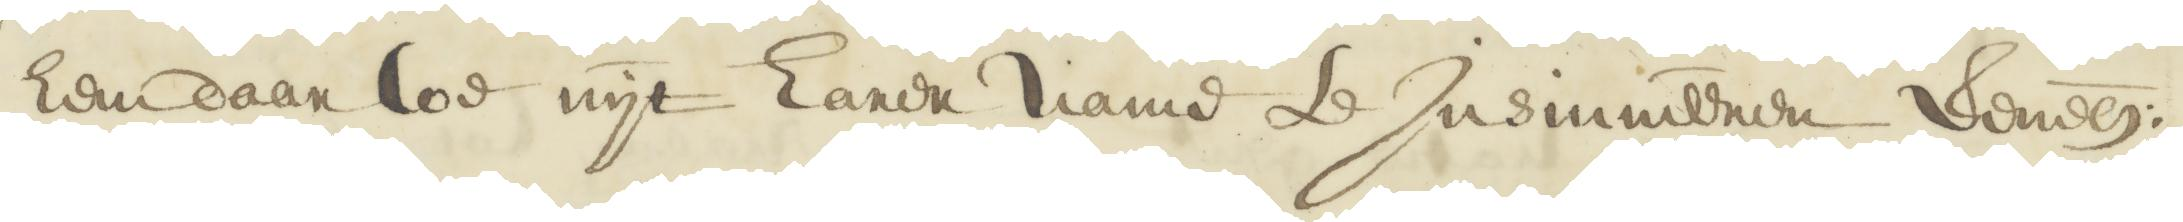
hem daar toe uijt harer tiame te Insinueeren Eenelijk
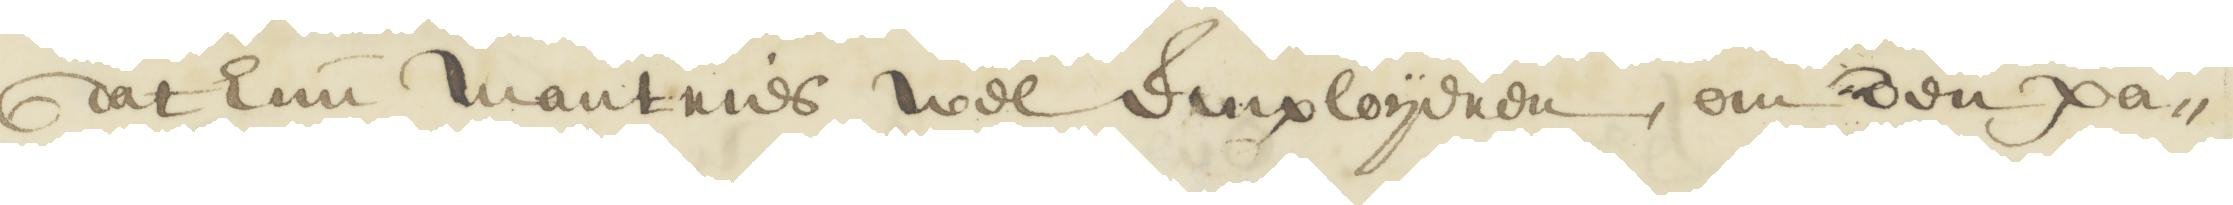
dat hun mantries wel Emploijeren, om den pa„
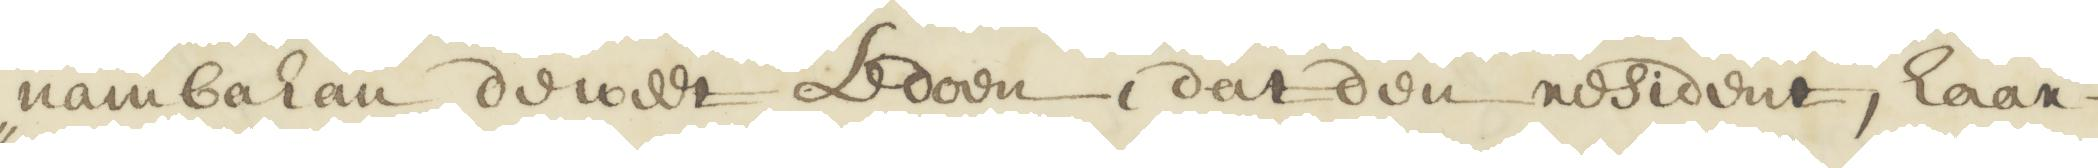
nambahan deweet te doen, dat den resident, haar
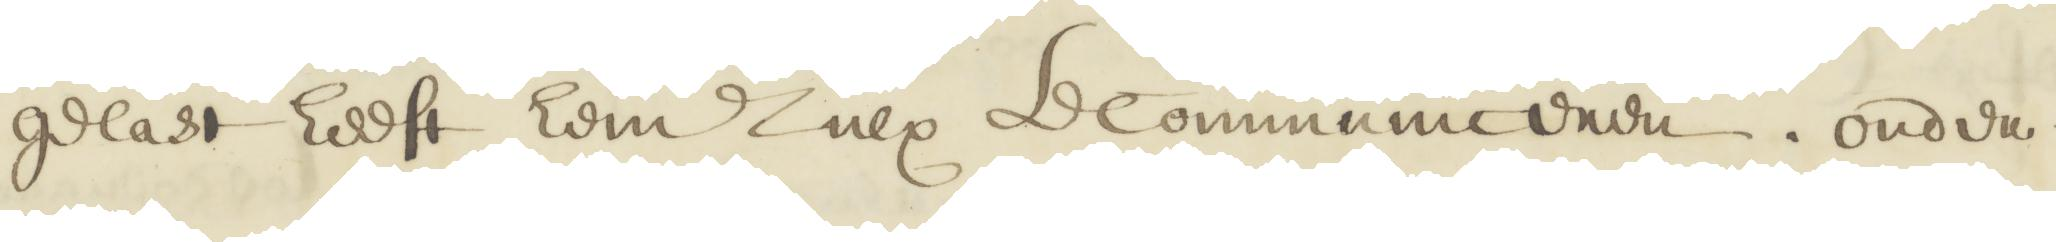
gelast heeft hem zulx te communiceren. onder
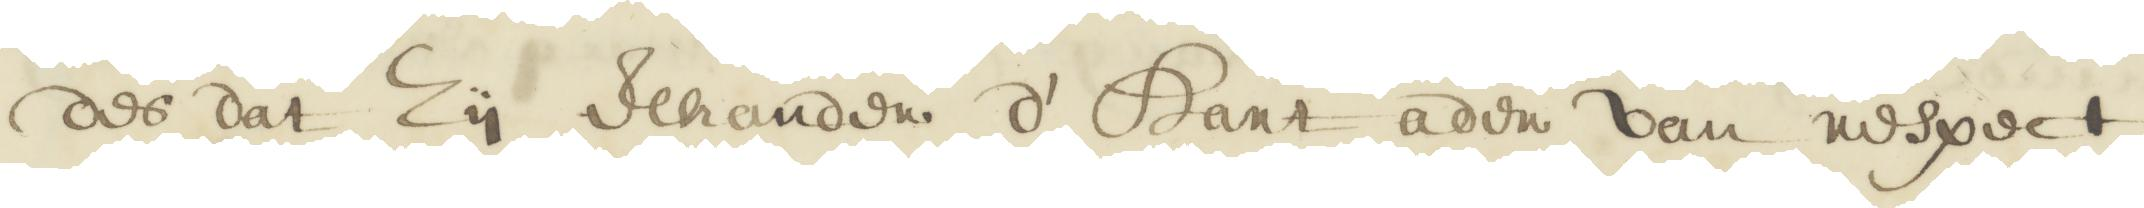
des dat zij Elkander. d’ Hart ader van respect
